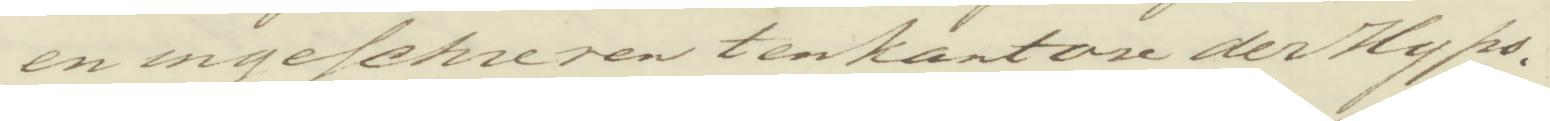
en ingeschreven ten kantore der Hypo„
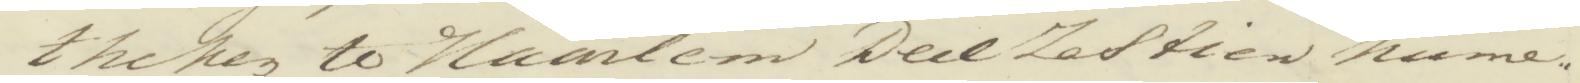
theken te Haarlem Deel Zestien Nume„
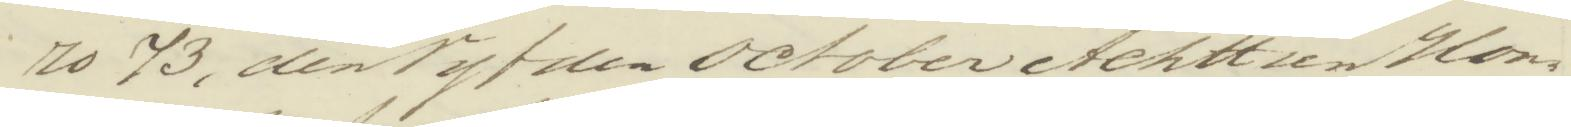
ro 73, den Vyfden October Achttien Hon
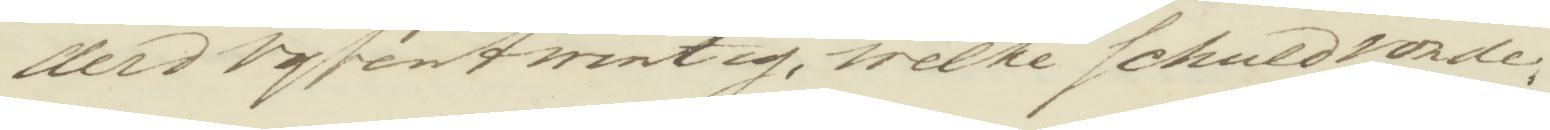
derd vyfentwintig, welke schuldvorde„
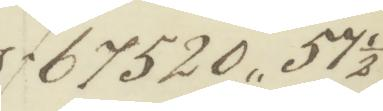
ƒ 67520„57½
